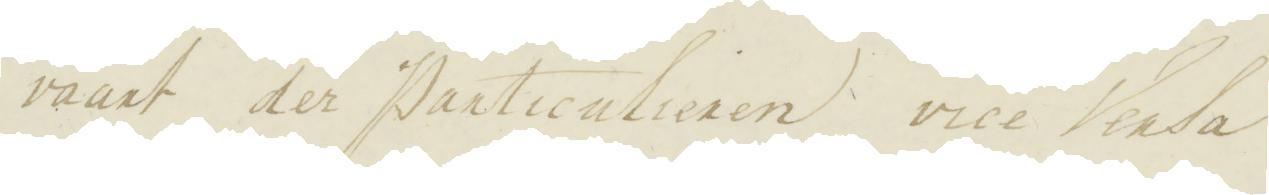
vaart der Particulieren vice Versa
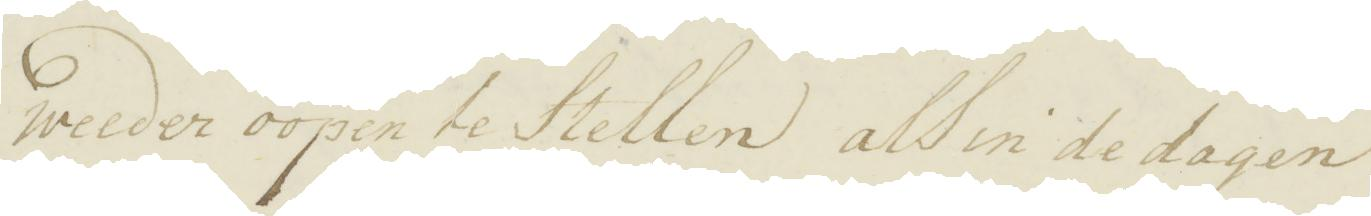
weeder oopen te stellen als in de dagen
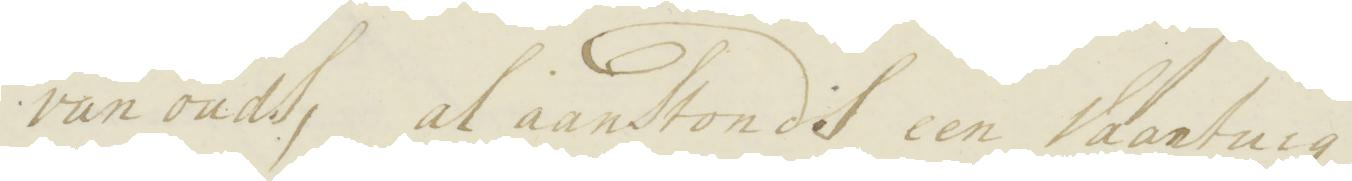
van ouds, al aanstonds een vaartuig
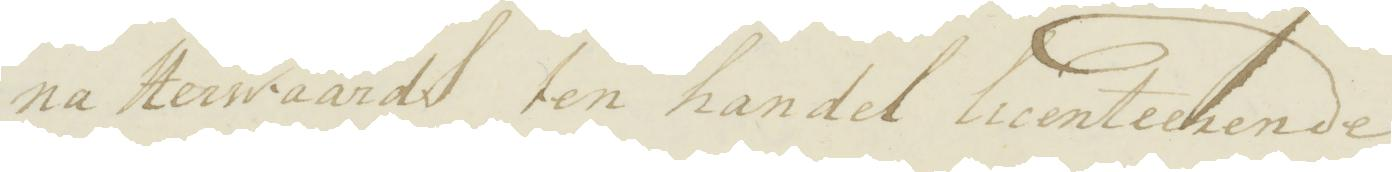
na Herwaards ten handel licenteerende
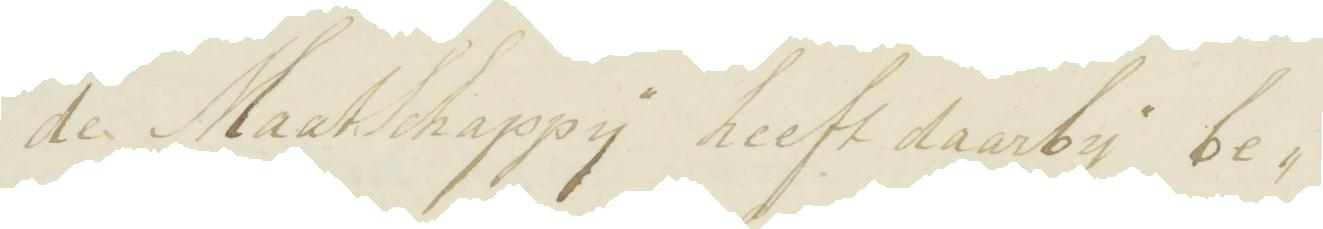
de Maatschappij heeft daarbij be„
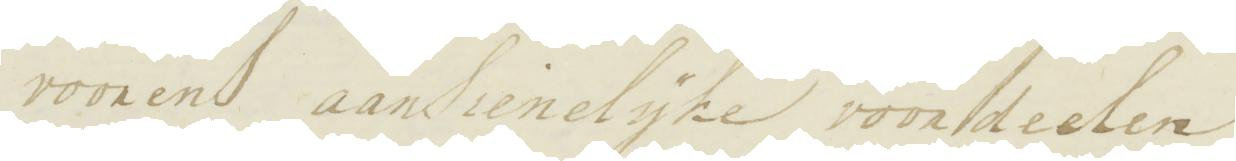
voorens aansienelijke voordeelen
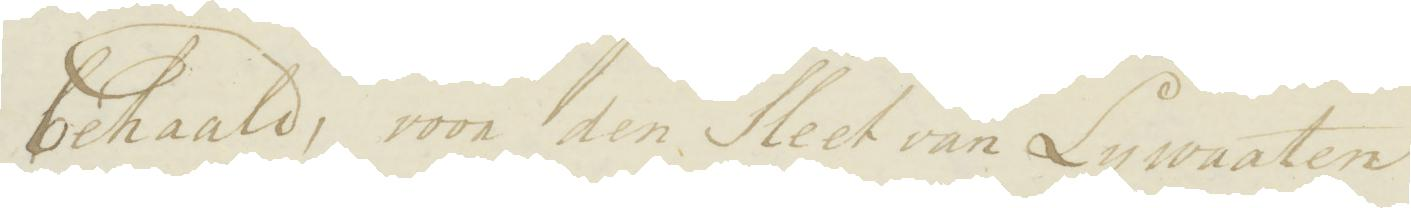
behaald, voor den sleet van Lywaaten
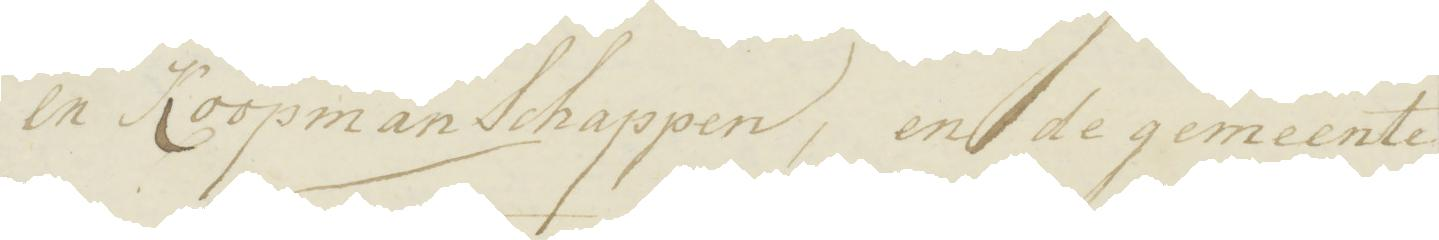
en Koopmanschappen, en de gemeente
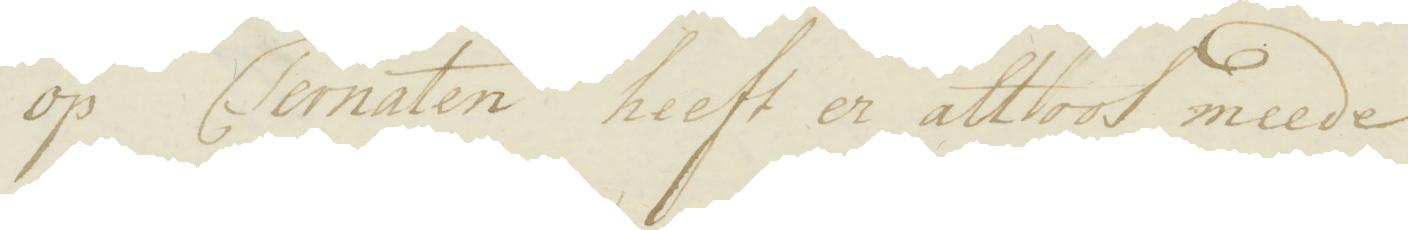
op Ternaten heeft er alttoos meede
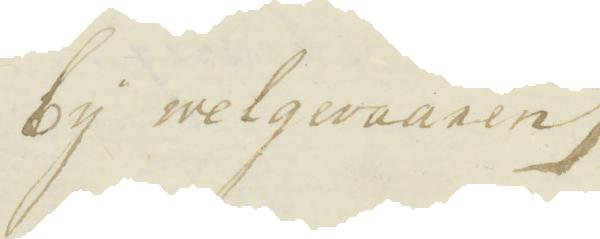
bij welgevaaren,
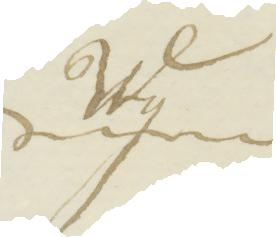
Wy
